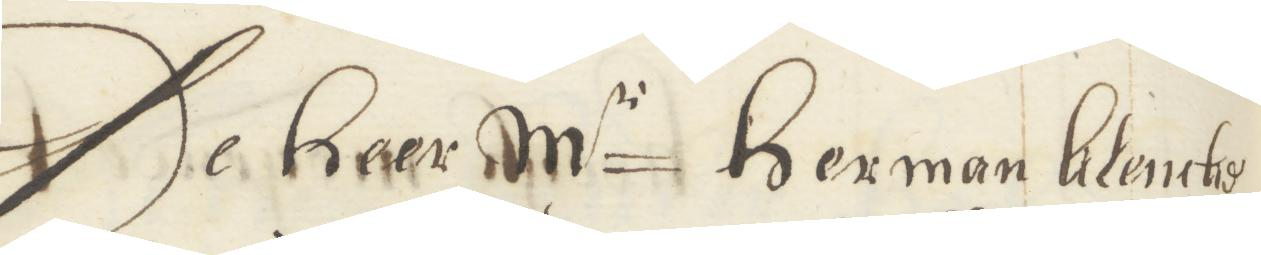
De heer M=r Herman klencke
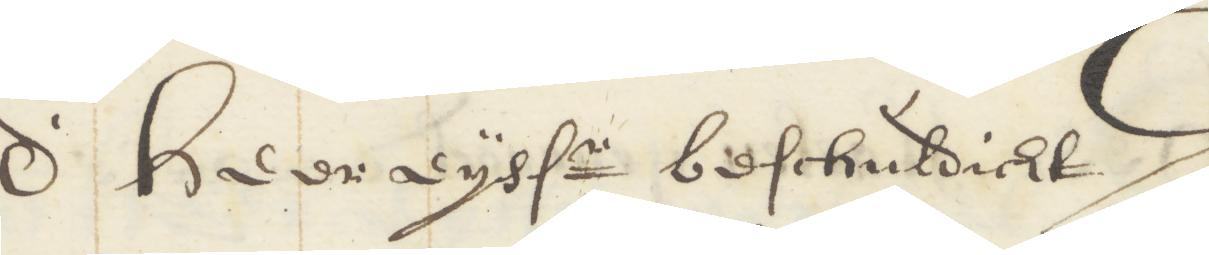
d' heer eijss=r beschuldicht
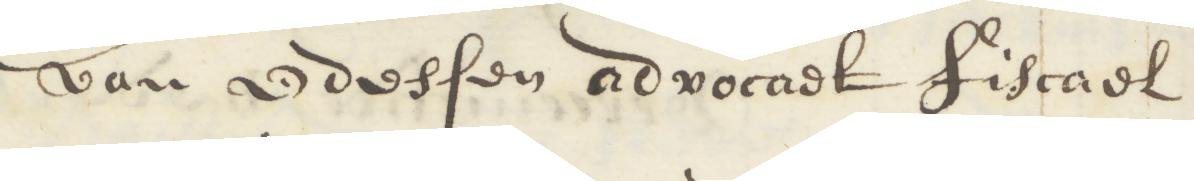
van Odessen advocaet fiscael
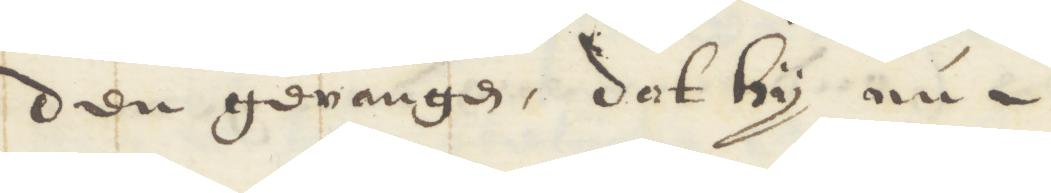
den gevangen, dat hij nu —
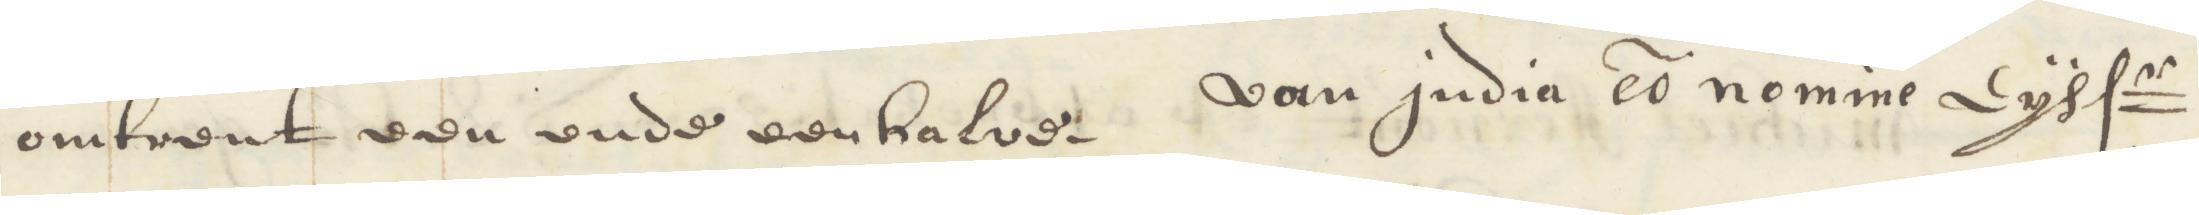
omtrent een ende een halve van jndia eo nomine Eijss=r
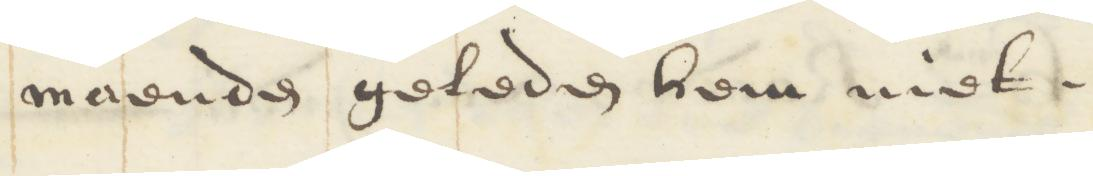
maenden geleden hem niet —
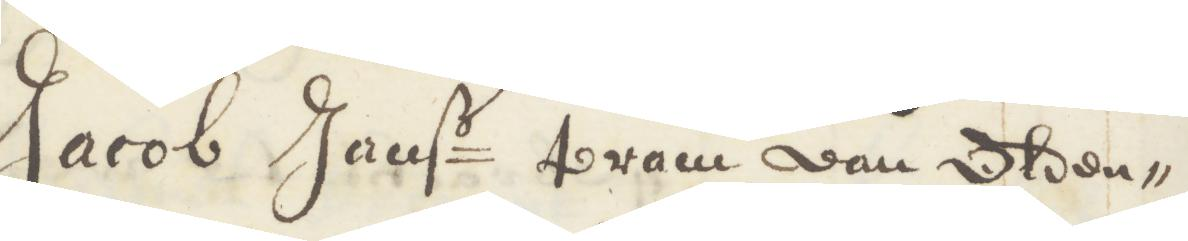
Jacob Jans= pram van Olden„
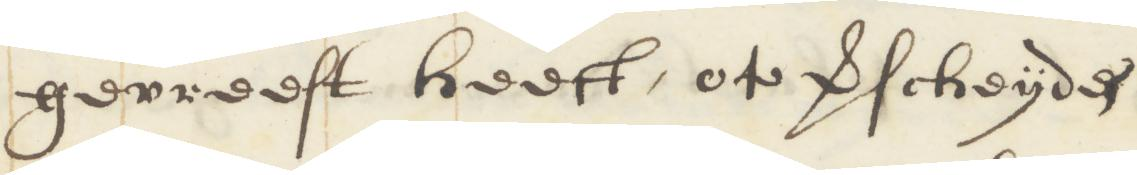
gevreest heeft, op verscheijde
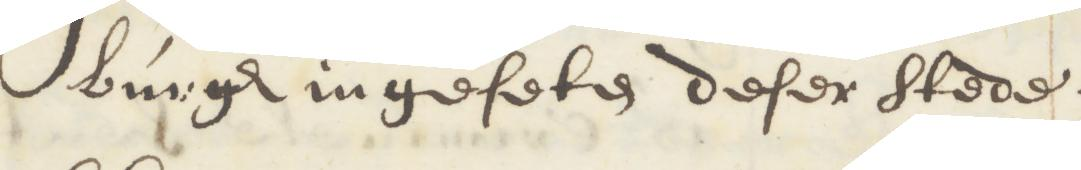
burgh ingeseten deser stede
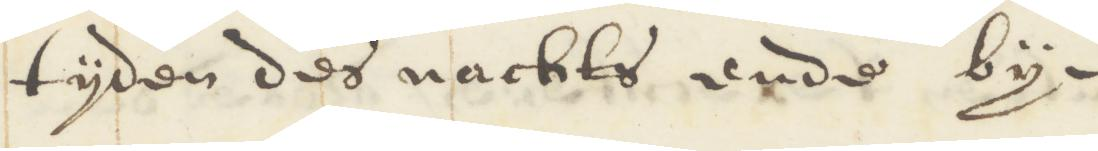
tijden des nachts ende bij —
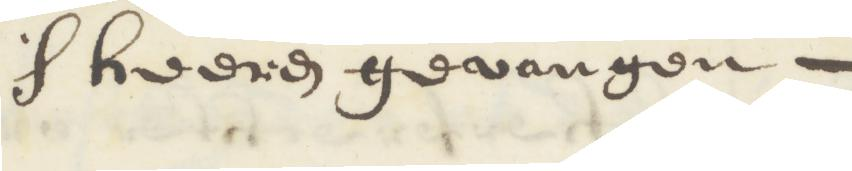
's heeren gevangen —
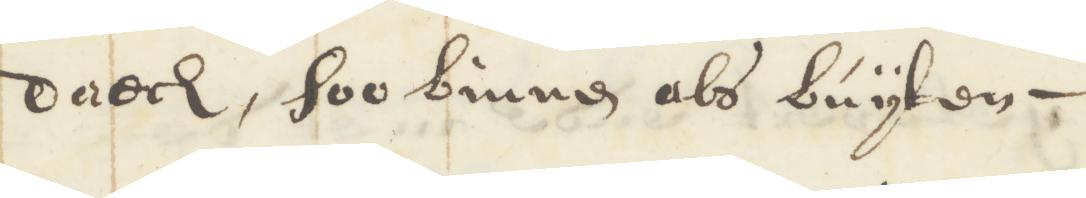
daech, soo binnen als buijten —
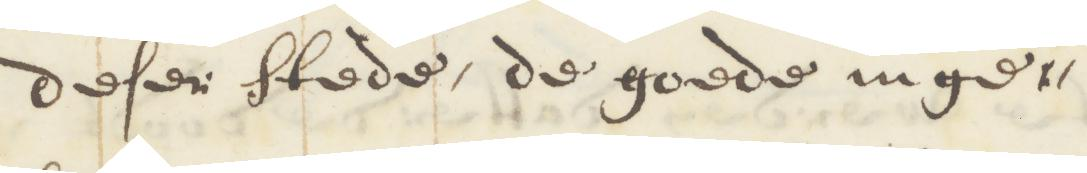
deser stede, de goede inge„
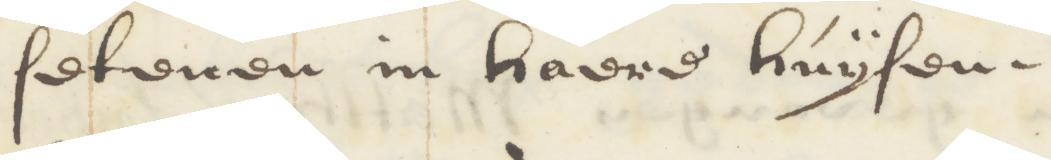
setenen in haere huijsen —
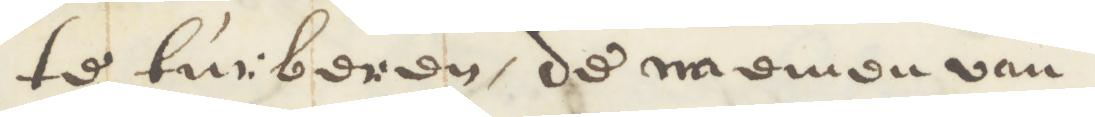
te turberen, de naemen van
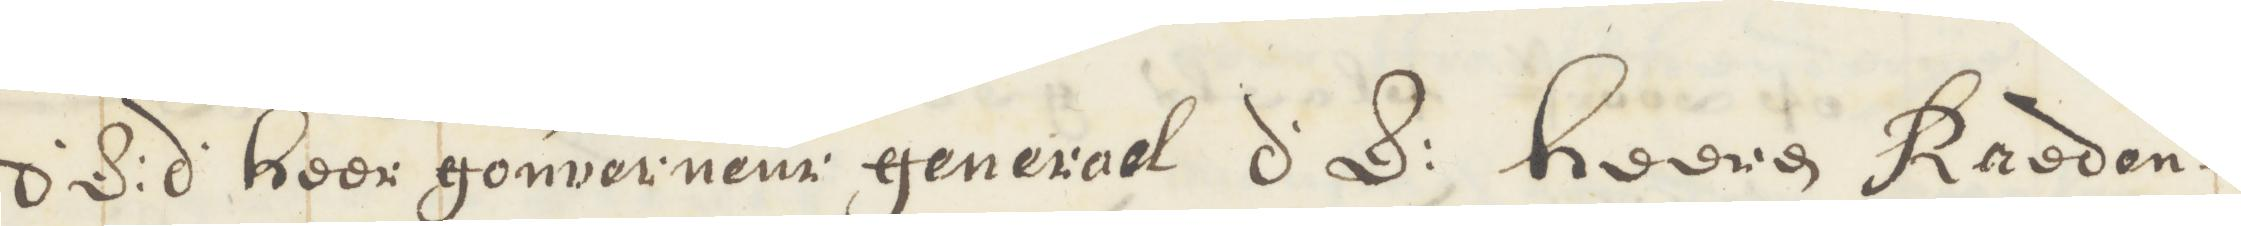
d’E: d’ heer gouverneur generael d’E: Heeren Raeden —
